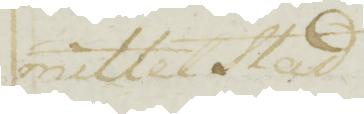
mittelstad
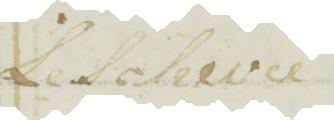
leschwee
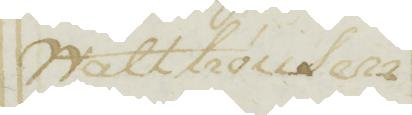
walthousen
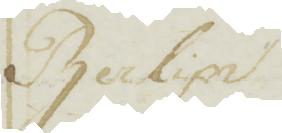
Berlijn
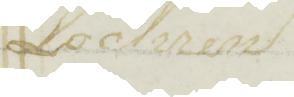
Lochren
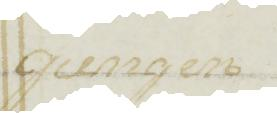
giengen
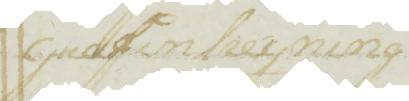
greefen heyring
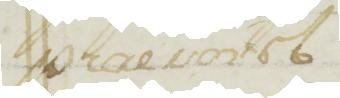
praevorst
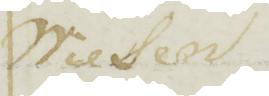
wiesen
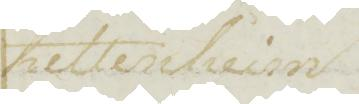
hettenheim
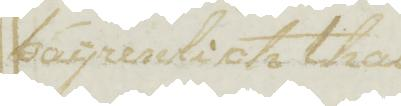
baijrenlichthal
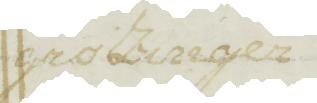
grozinger
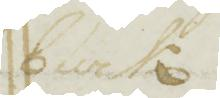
burk
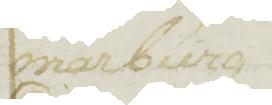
marburg
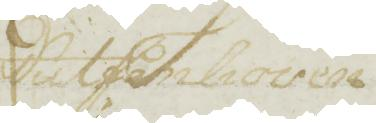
dutfenhoven
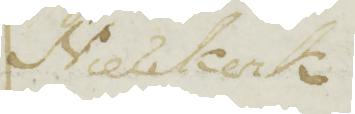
Nieukerk
